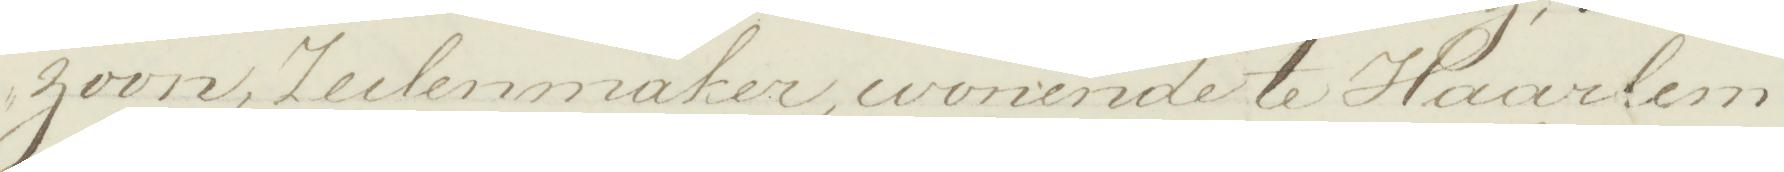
„zoon, Zeilenmaker, wonende te Haarlem
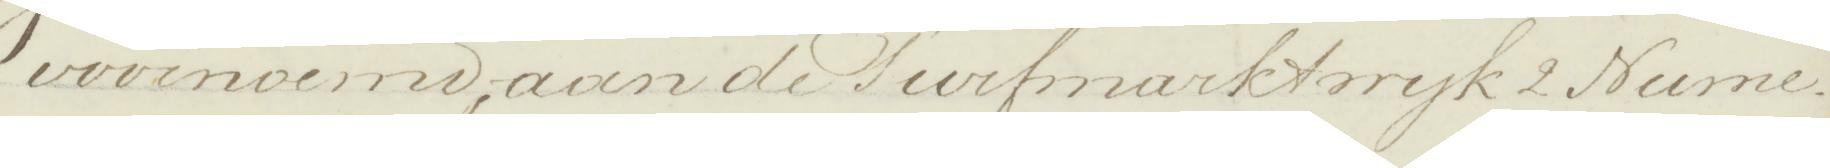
voornoemd, aan de Turfmarkt wyk 2 Nume.
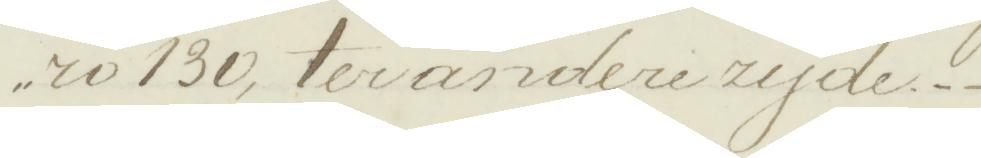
„ro 130, ter andere zyde.-
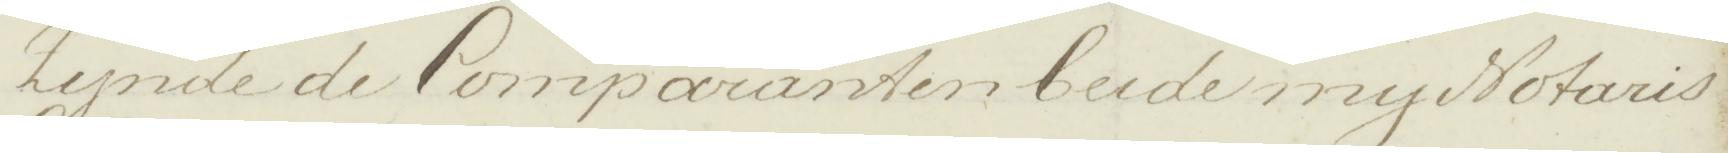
Zynde de Comparanten beide my Notaris
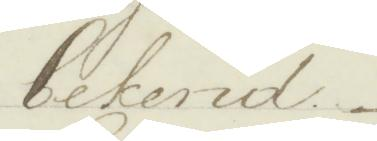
bekend.—
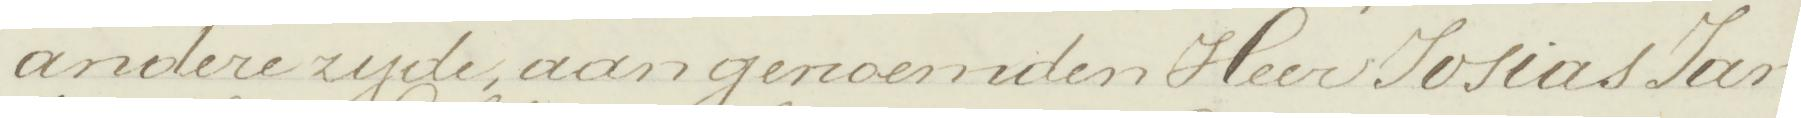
andere zyde, aan genoemden Heer Iosias Ian
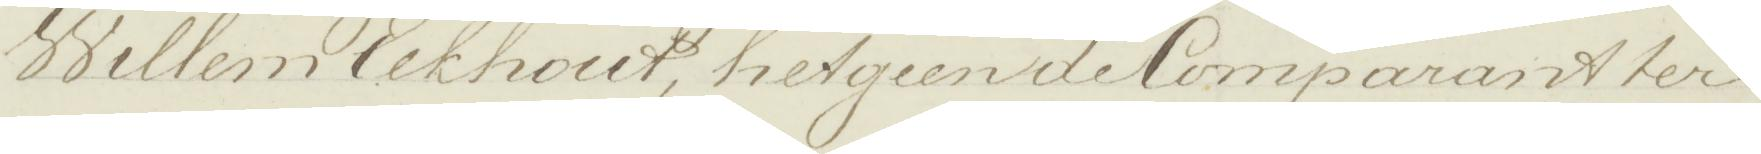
Willem Eekhout, hetgeen de Comparant ter
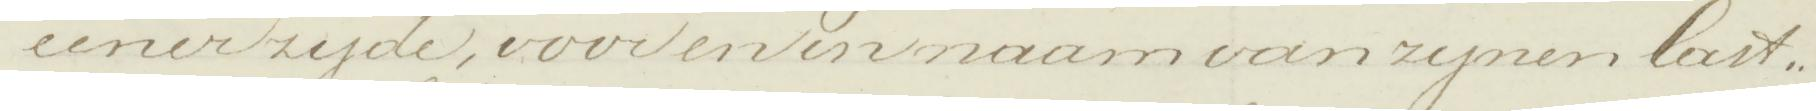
eener zyde, voor en in naam van zynen last„
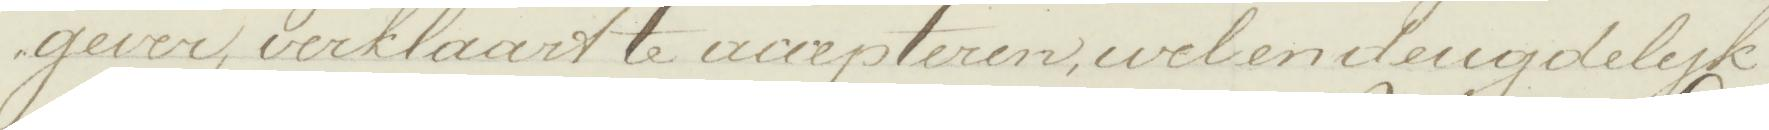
„gever, verklaart te accepteren, wel en deugdelyk
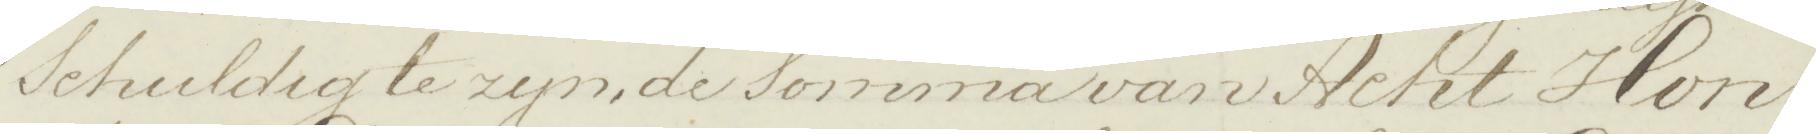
schuldig te zyn, de somma van Acht Hon
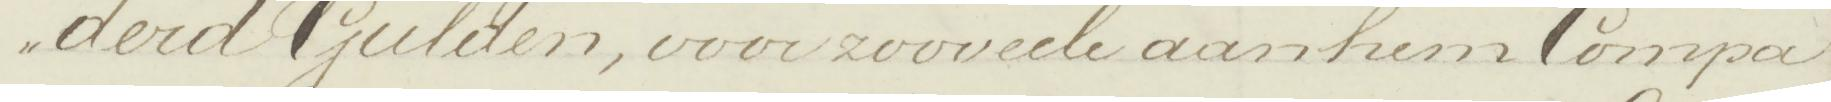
„derd Gulden, voor zooveele aan hem Compa
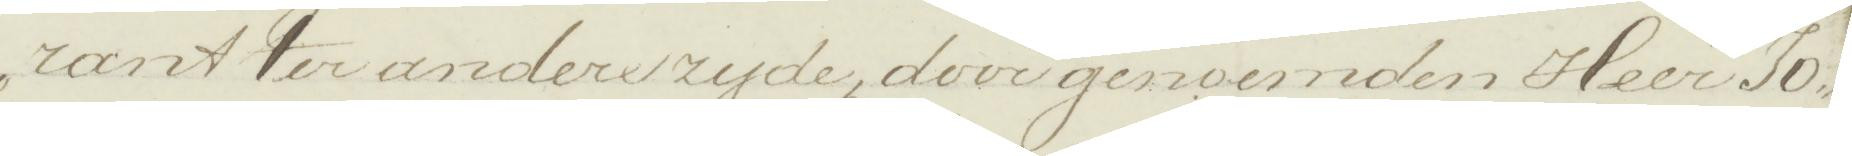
rant ter andere zyde, door genoemden Heer Io„
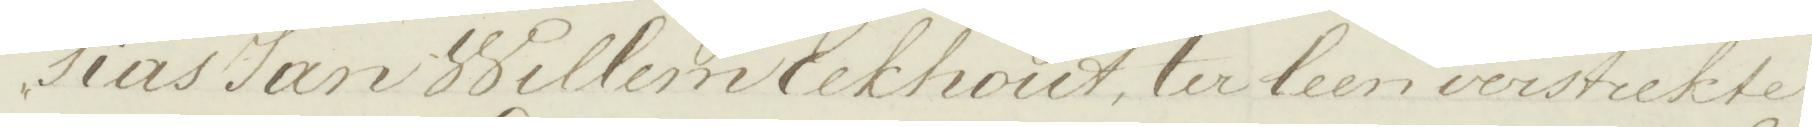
„sias Ian Willem Eekhout, ter leen verstrekte
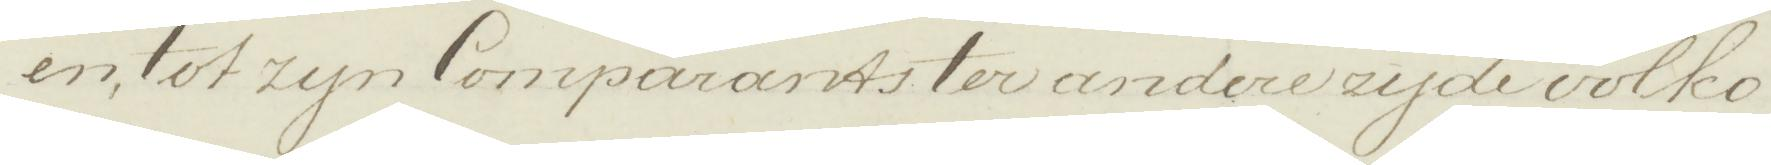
en, tot zyn Comparants ter andere zyde volko
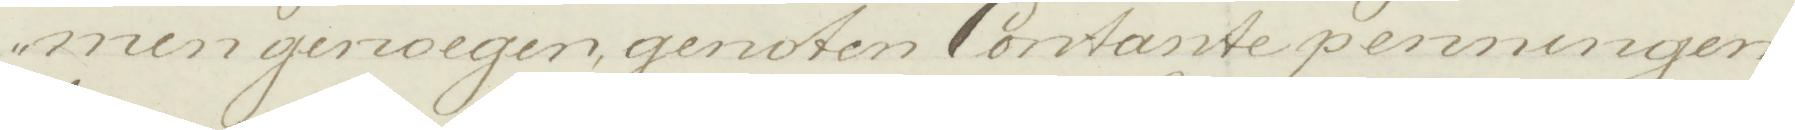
„men genoegen, genoten Contante penningen,
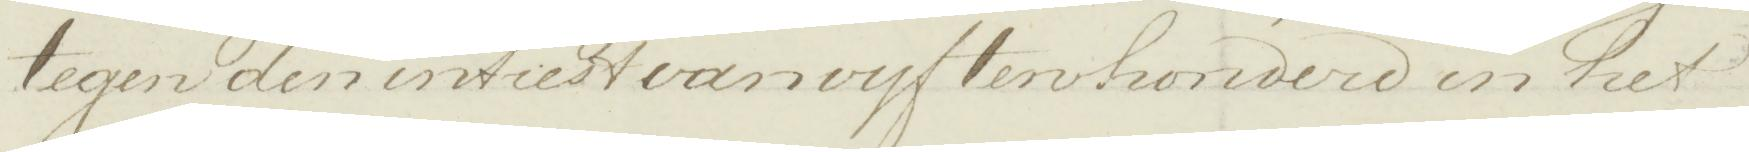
tegen den intrest van vyf ten honderd in het
